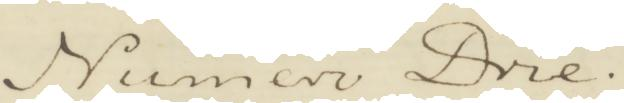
Numero Drie.
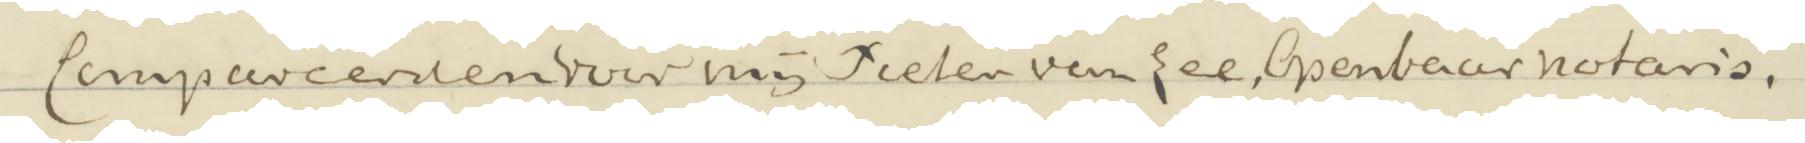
Compareerden voor mij Pieter van Lee, Openbaar notaris,
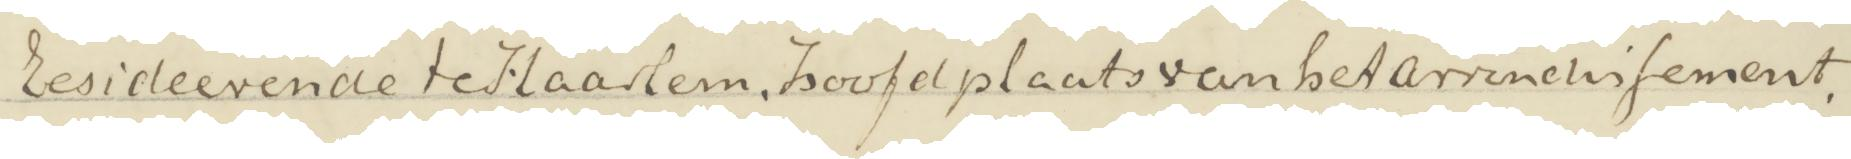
resideerende te Haarlem, hoofdplaats van het arrondissement.
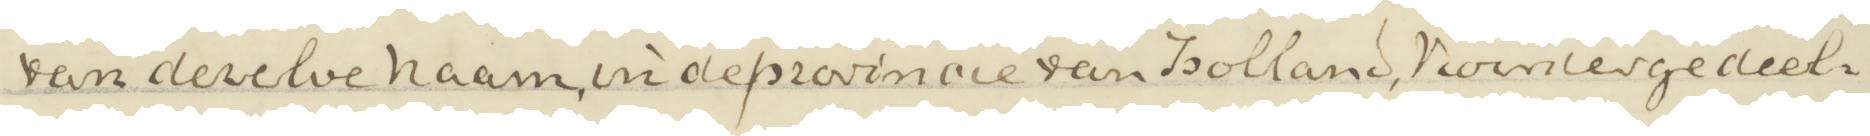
van dezelve naam in de provincie van Holland, Noorder gedeel
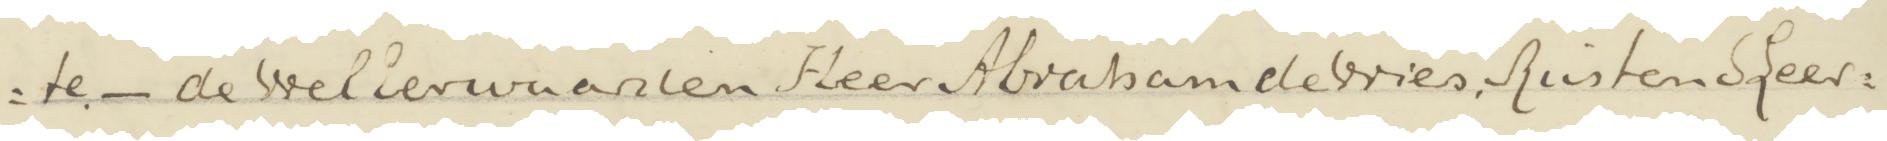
„te - de Wel Eerwaarden Heer Abraham de vries, Rustend Leer=
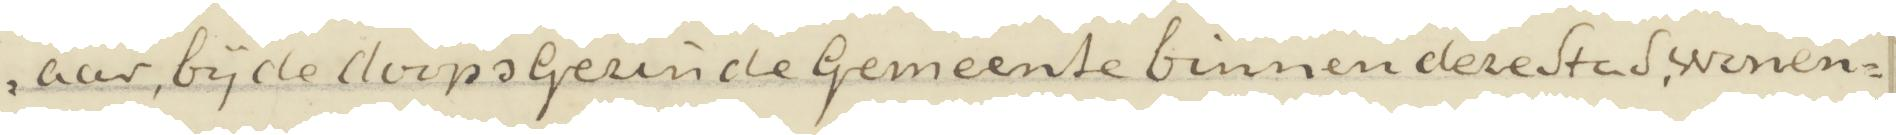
„aar, bij de doopsgezinde Gemeente binnen deze stad, wonen=
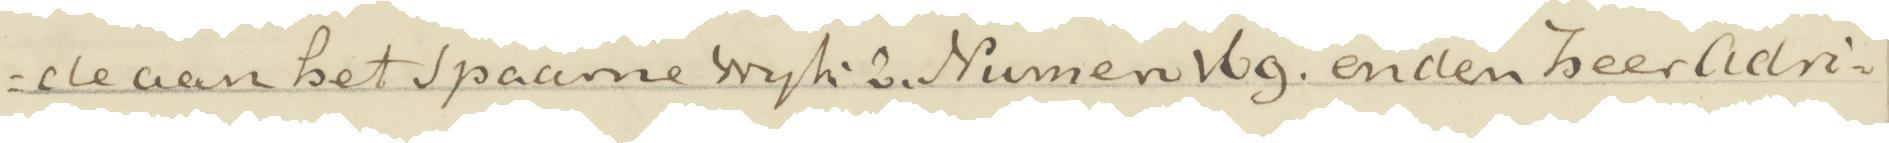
=de aan het Spaarne Wyk 2. Numero 169. en den heer Adri=
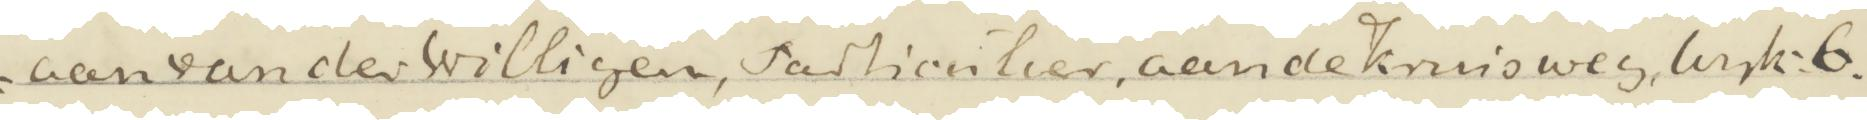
„aan van der Willigen, particulier, aan de kruisweg, wyk: 6,
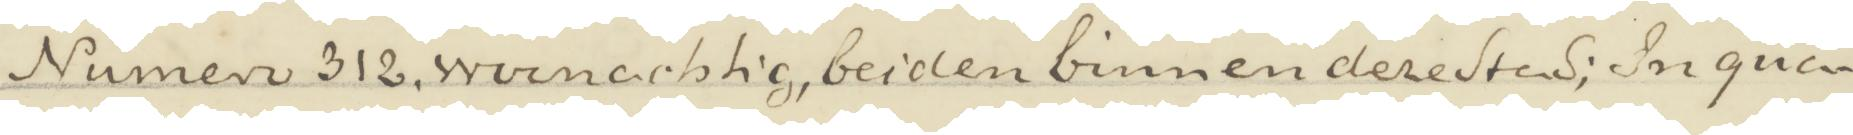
Numero 312. woonachtig, beiden binnen dezen stad, In qua-
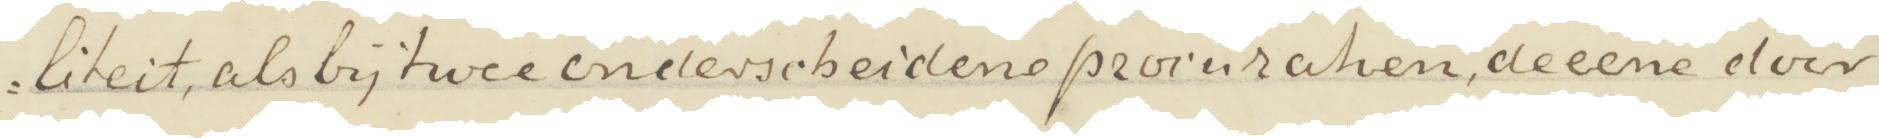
„liteit, als bij twee onderscheidene procuratien, de eene door
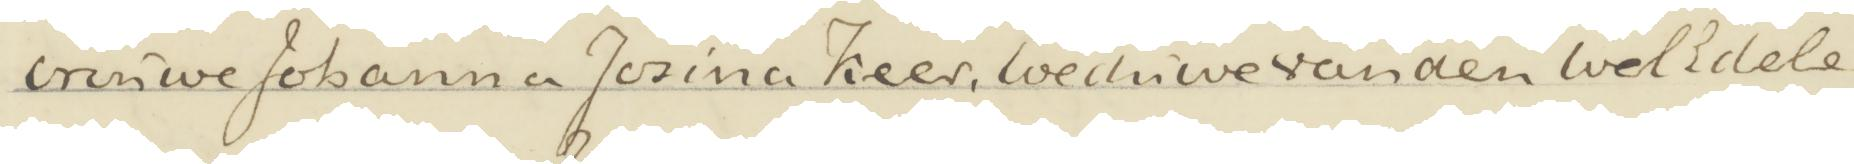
vrouwe Johanna Josina Keer, weduwe van den wel Edele
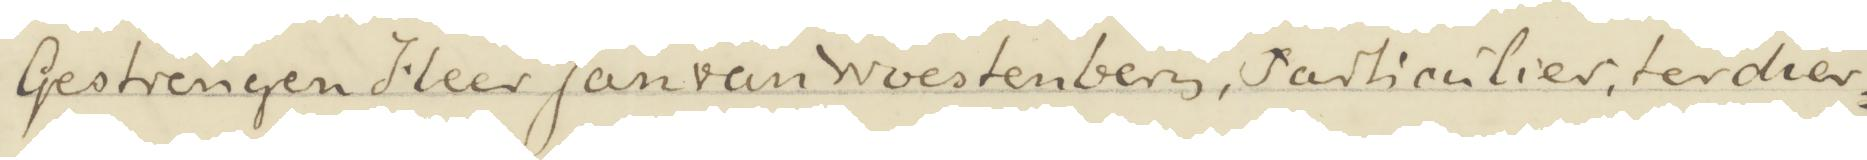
Gestrengen Heer Jan van Woestenberg, Particulier, ter dier
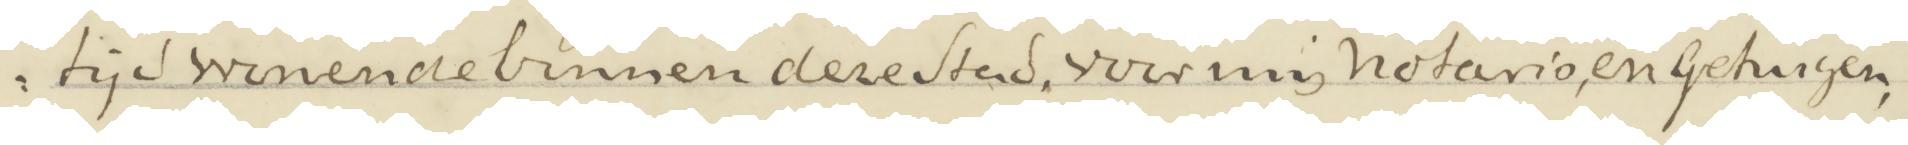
„tijd wonende binnen deze Stad, voor mij Notaris en getuigen,
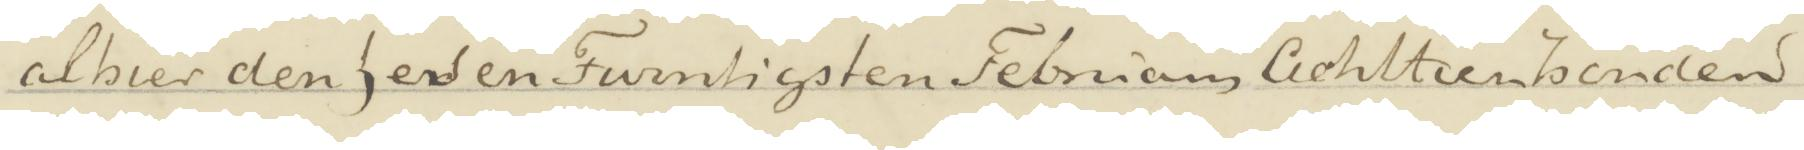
alhier den zes en Twintigsten Februarij Achttien honderd
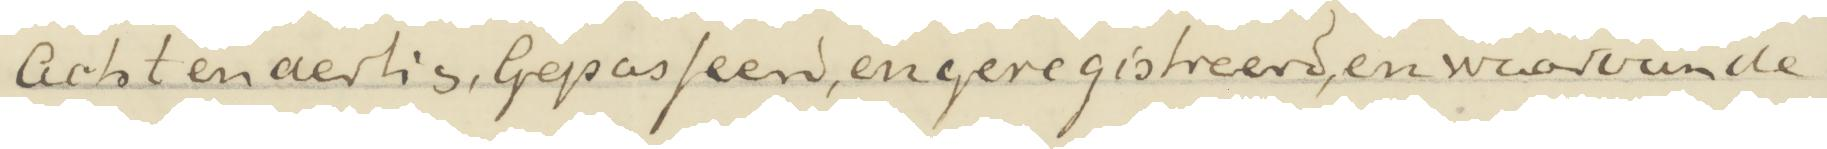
Acht en dertig Gepasseerd, en geregistreerd, en waarvan de
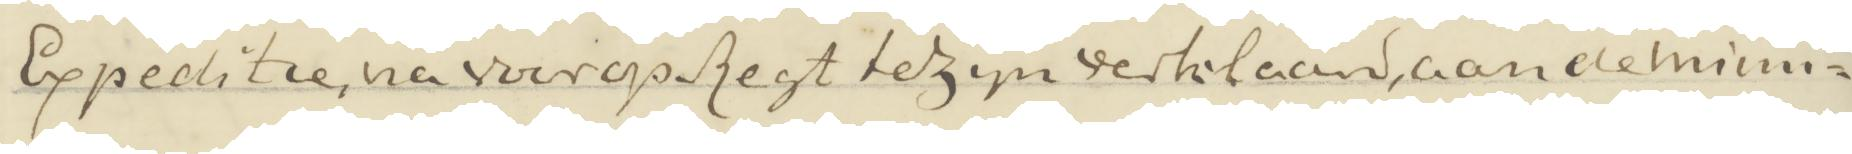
Expeditie, na voor op Regt te Zijn verklaard, aan de minu=
